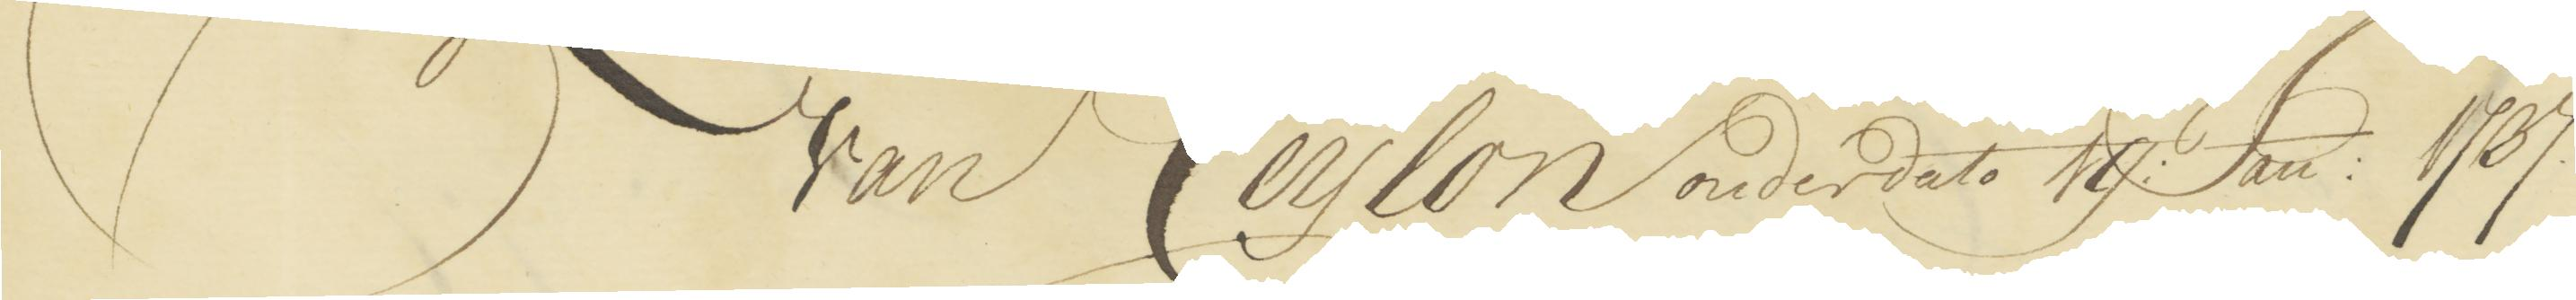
Van Ceijlon onderdato 19: Ian: 1737
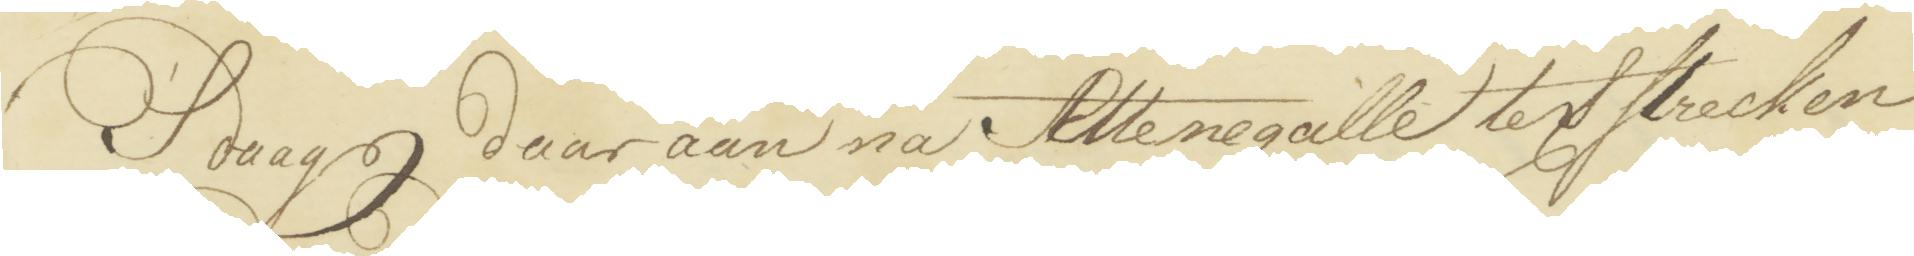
'S daags daar aan na Attenegalle te verstrecken
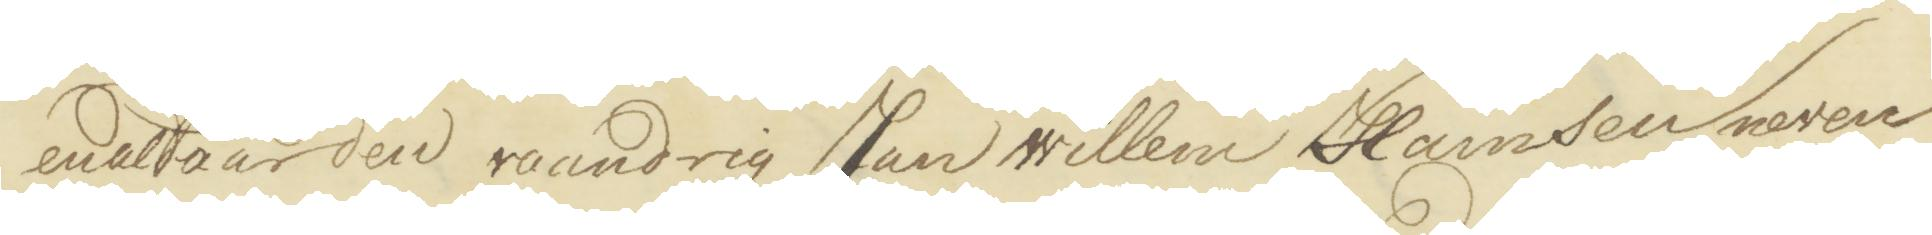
enaldaar den vaandrig Jan Willem Hamsen neven
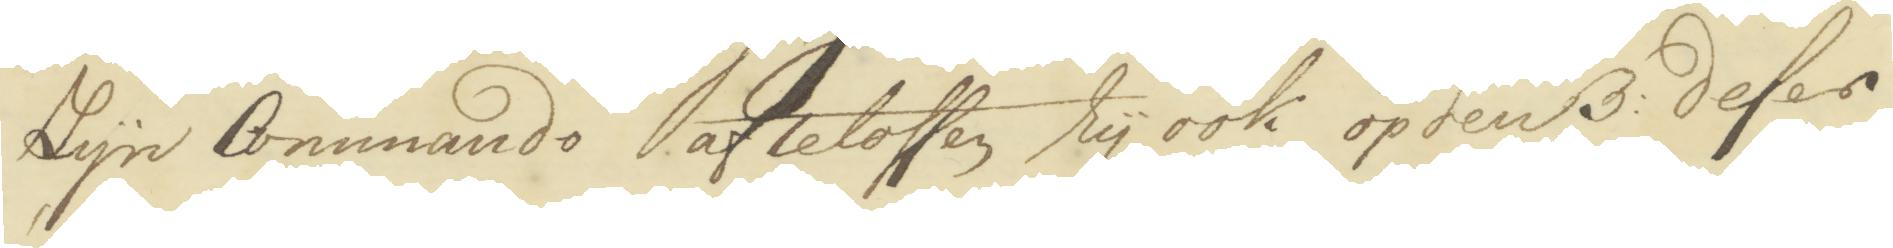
zijn Commando aftelossen hij ook op den 3: deses
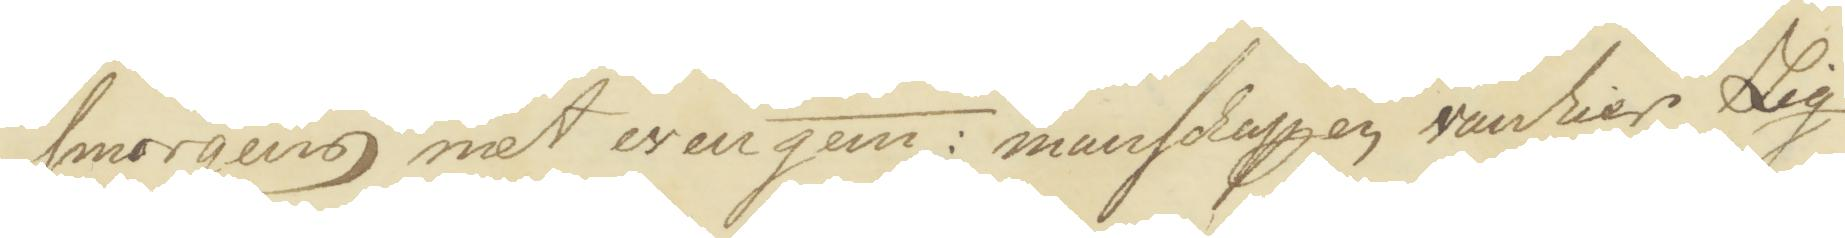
'smorgens met even gem: manschappen vanhier zig
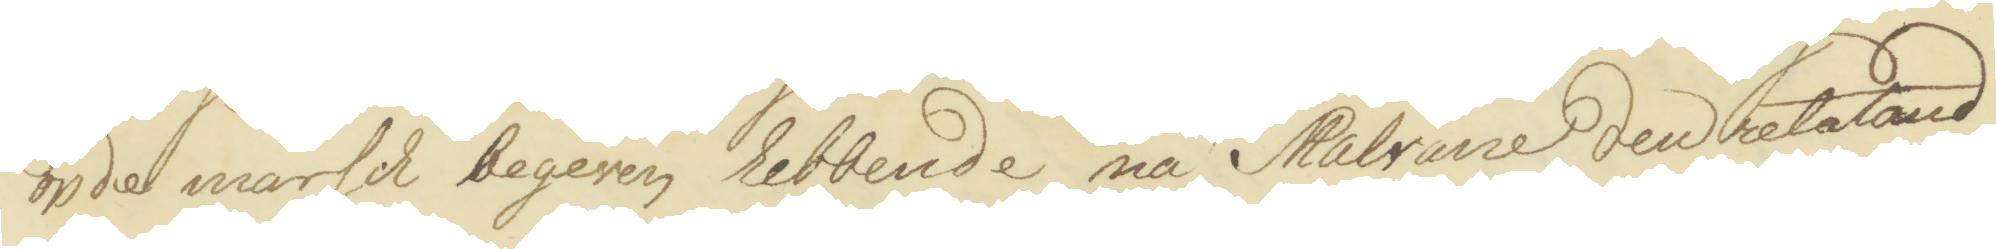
opde marsch begeven hebbende na Malvane den relatand
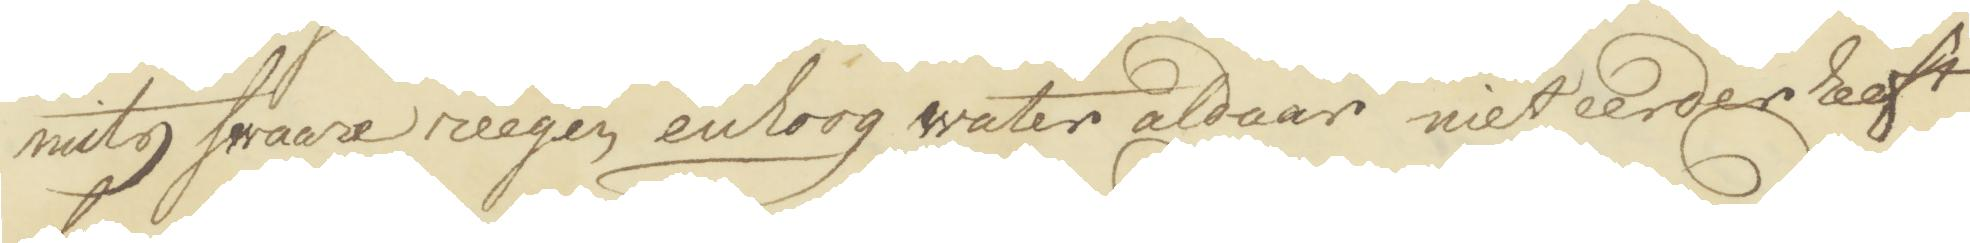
mits swaare reegen enhoog water aldaar niet eerder heeft
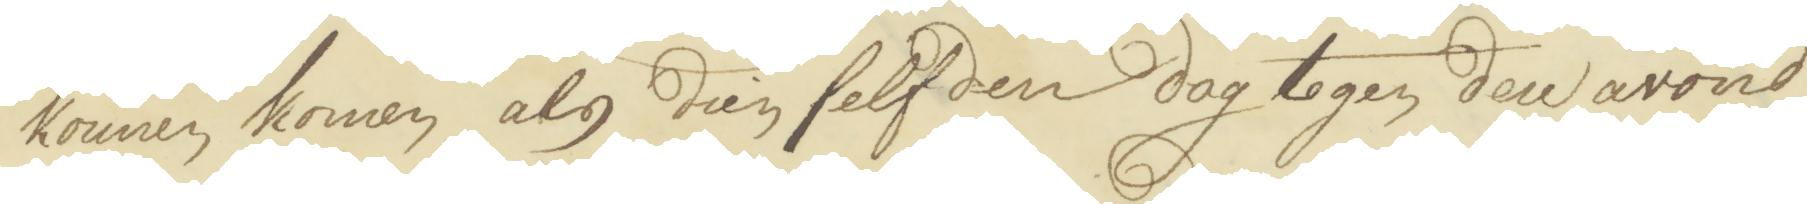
konnen komen als dien selfden dog tegen den avond
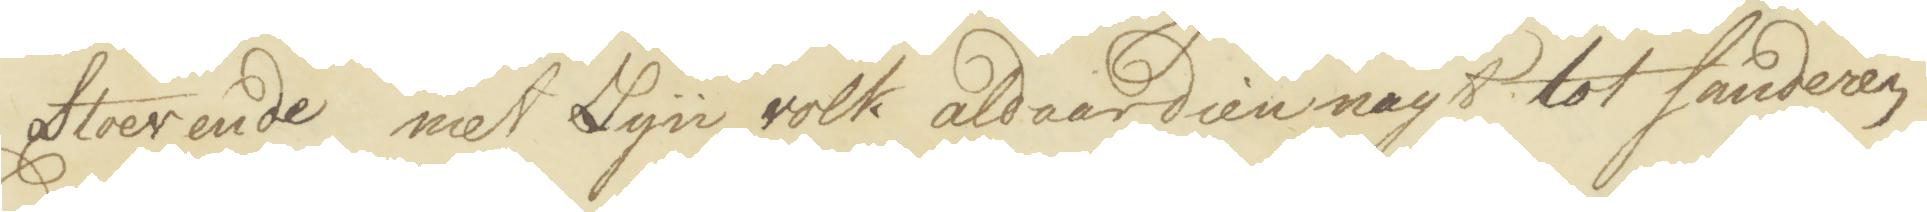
vertoevende met zijn volk aldaar dien nagt tot sanderen
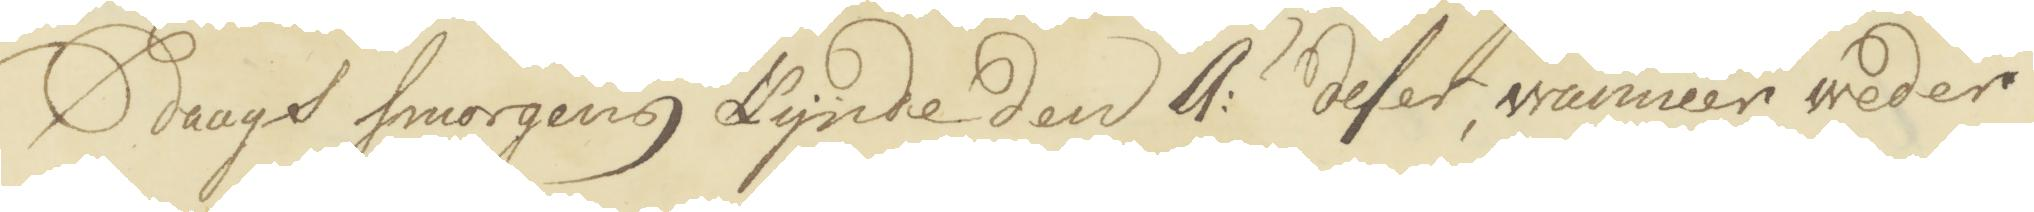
'sdaags smorgens zijnde den 4: deser, wanneer weder
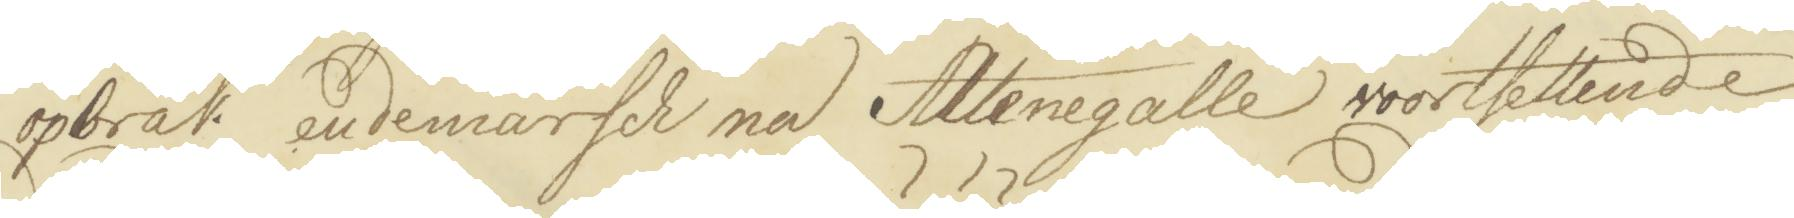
opbrak en demarsch na Attenegalle voortsettende
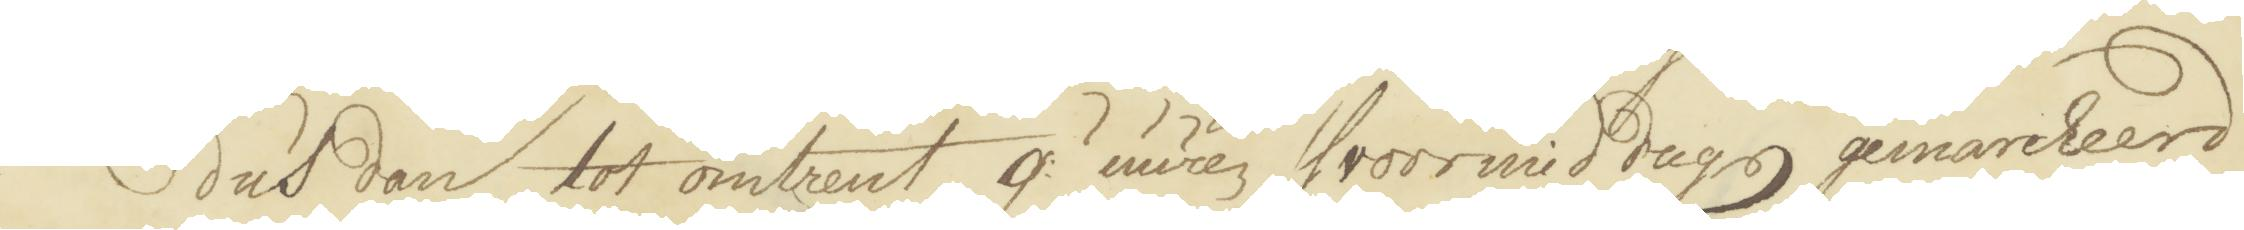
dus dan tot omtrent 9:’ uren 's voormiddags gemarcheerd
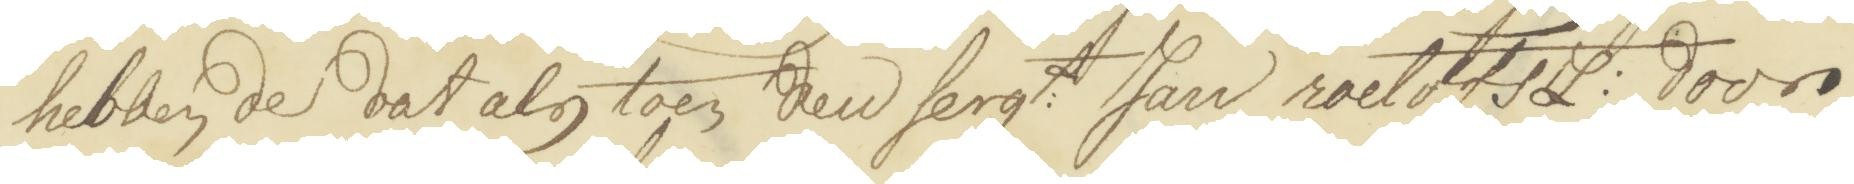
hebben de dat als toen den serg:t Jan roelofsz: door
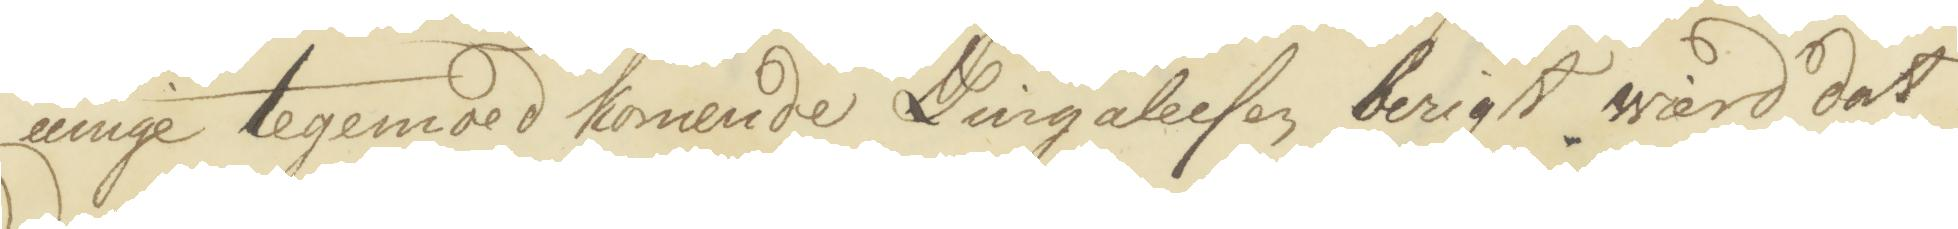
eenige tegemoed komende Zingaleesen berigt, wierd dat
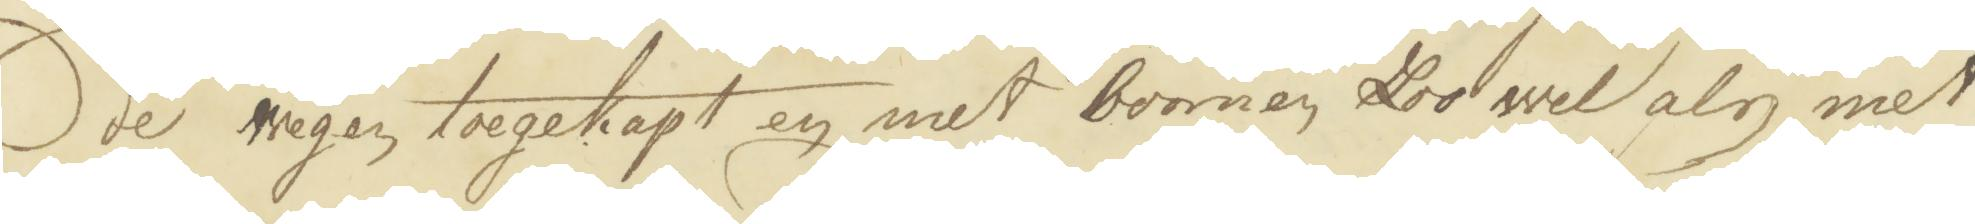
de wegen toegekapt en met bomen zoo wel als met
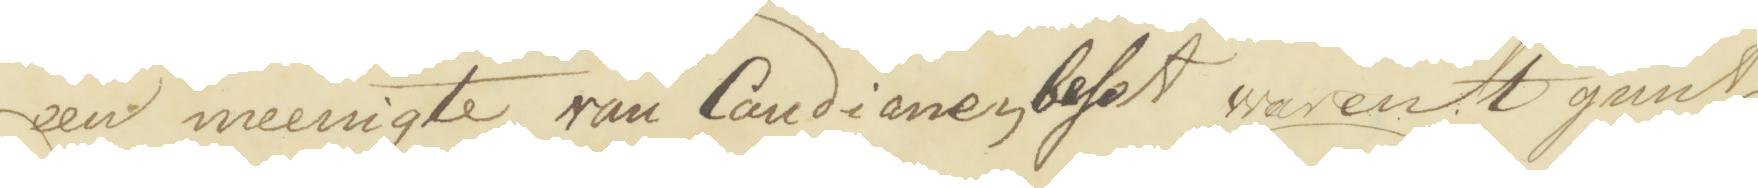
een meenigte van Candianen beset waren 't gunt
